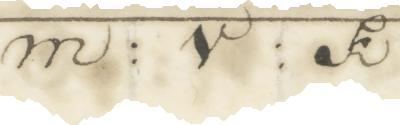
m : v : k
